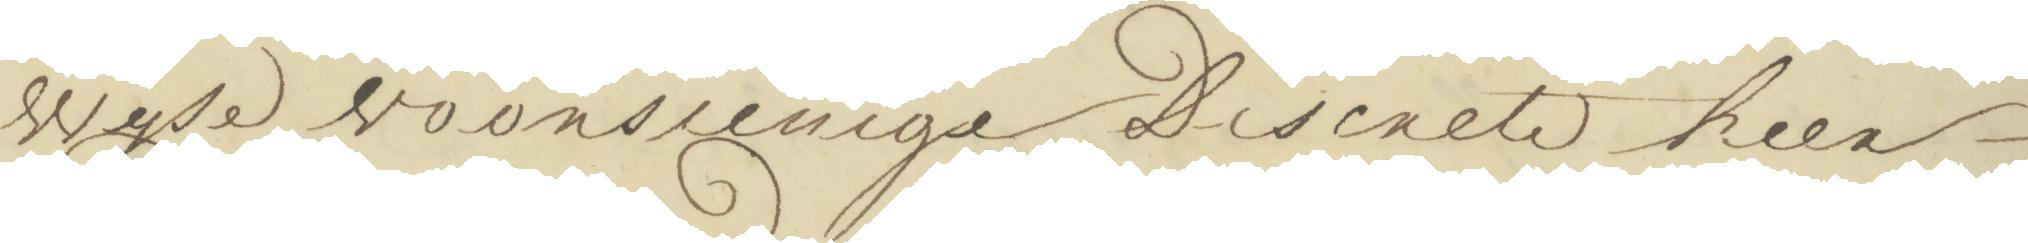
Wijse voorsienige Discrete heer
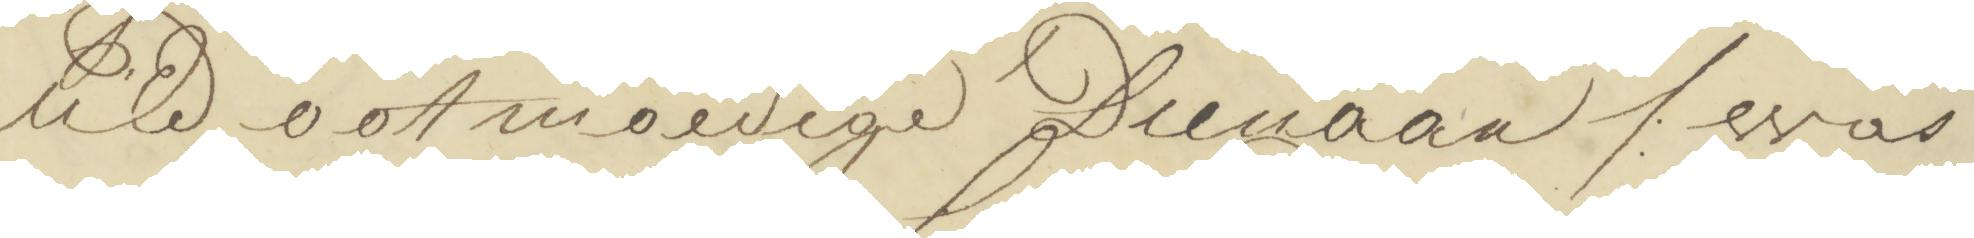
u Ed oot moedige Dienaar /: was
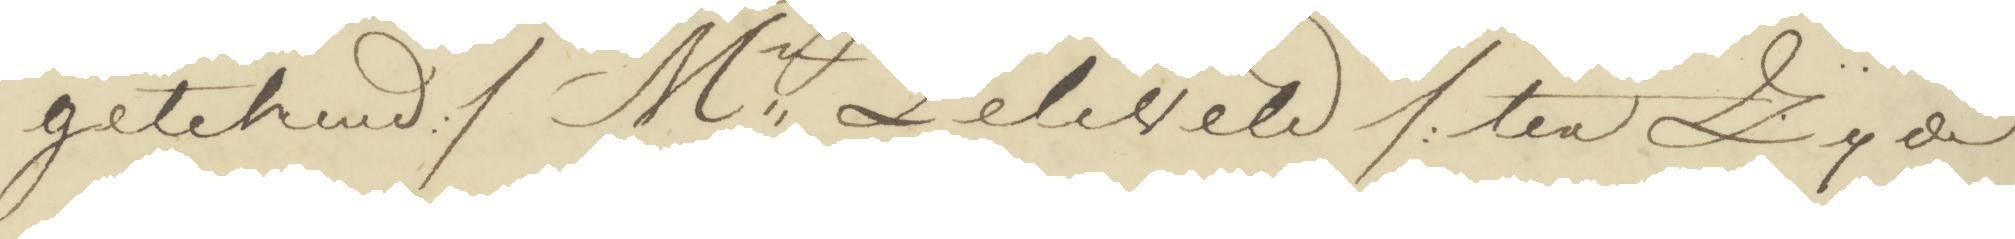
getekend:/ M:n Leliveld /: ter Zijde
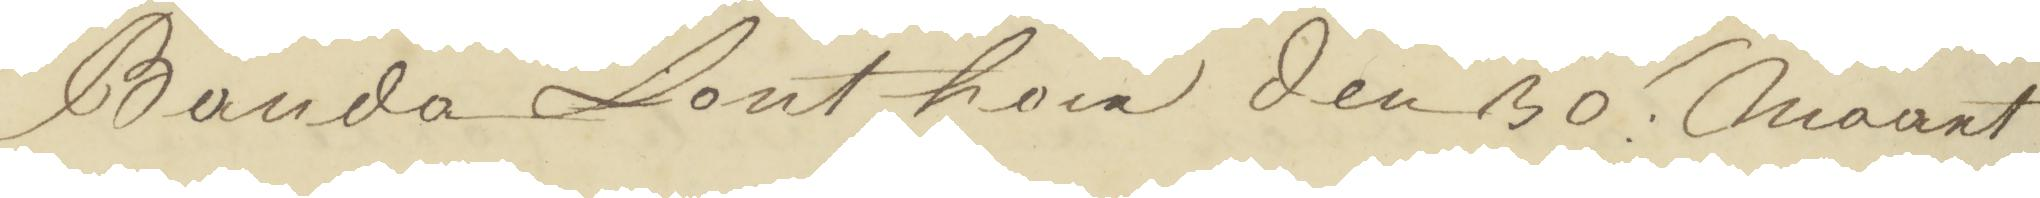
Banda Lonthoir den 30:' maart
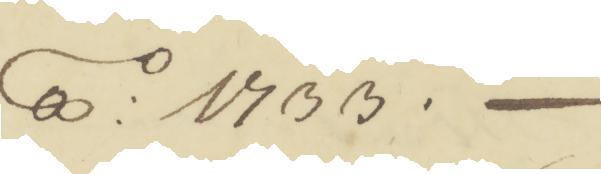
a:o 1733:—
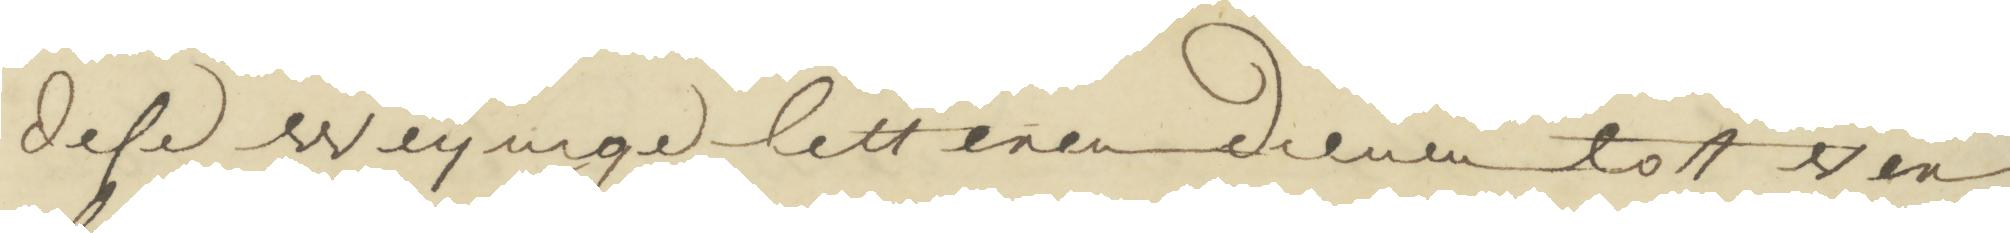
dese weijnige letteren dienen tot ver
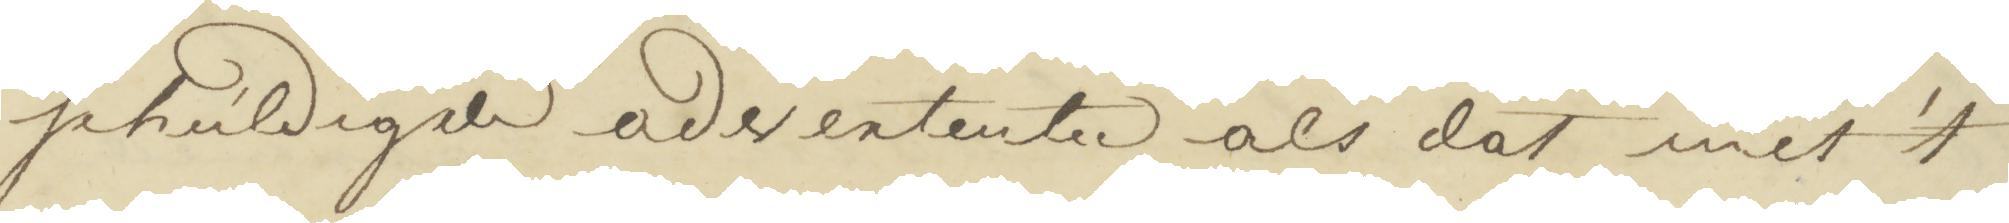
schuldige advertentie, als dat met ’t
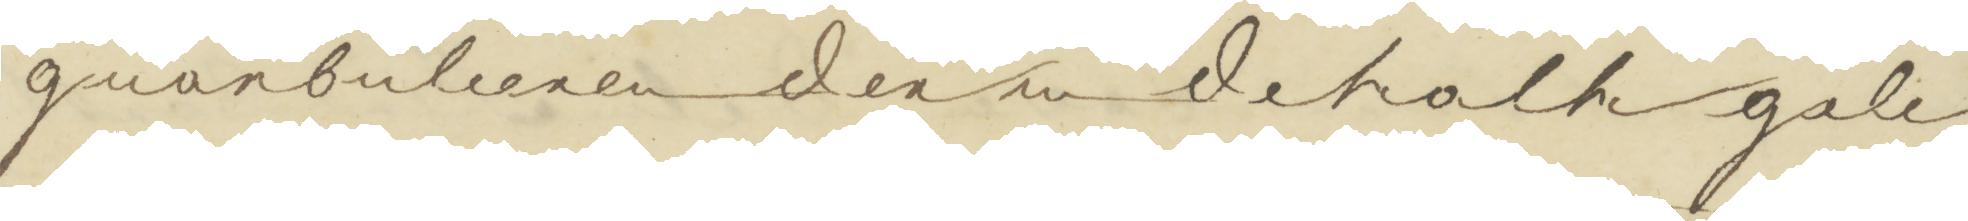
quarbulieren der in de kalk gele
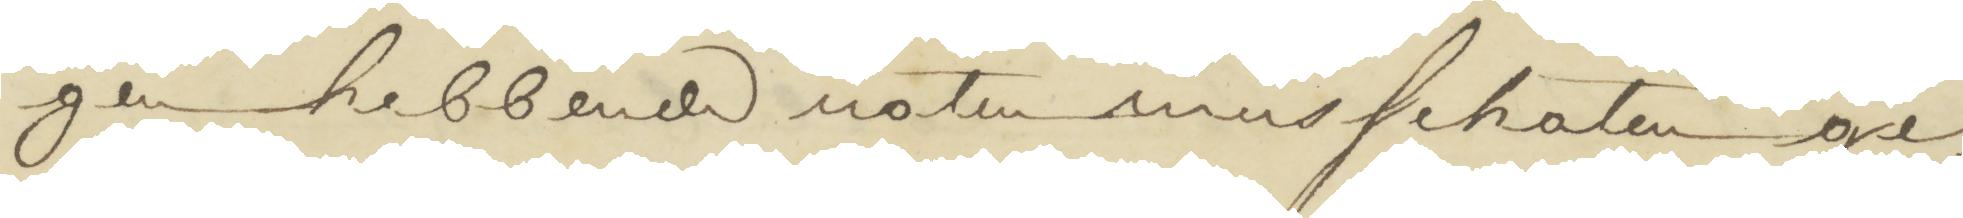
gen hebbende noten musschaten, ge„
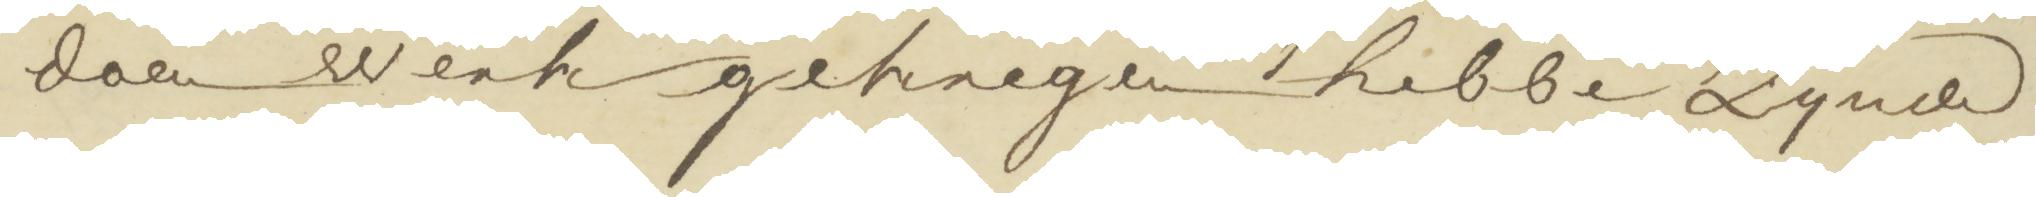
daen werk gekregen hebbe Zijnde
